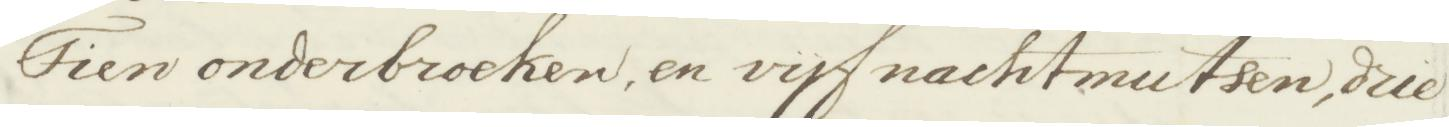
Tien onderbroeken, en vijf nachtmutsen, drie
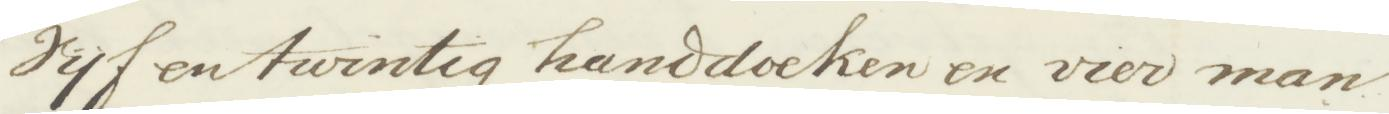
Vijf en twintig handdoeken en vier man
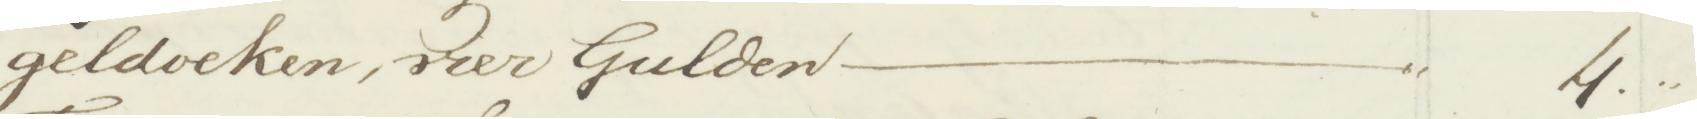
geldoeken, vier Gulden—„ 4.„
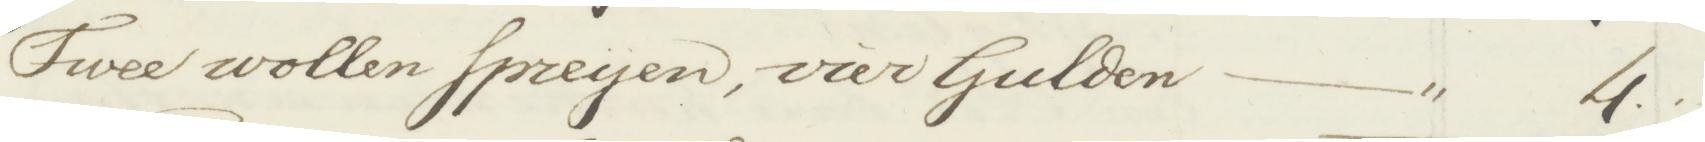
Twee wollen spreijen, vier Gulden—„ 4.„
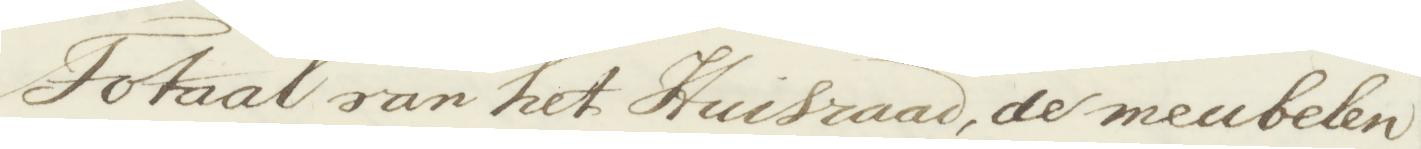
Totaal van het Huisraad, de meubelen
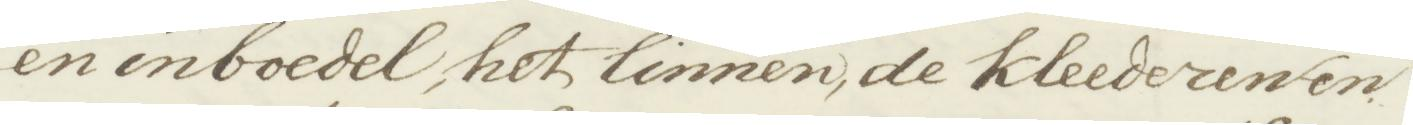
en inboedel, het linnen, de kleederen en
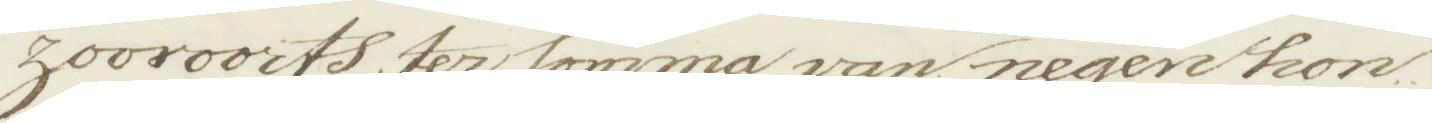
zoovoorts, ter somma van negen hon„
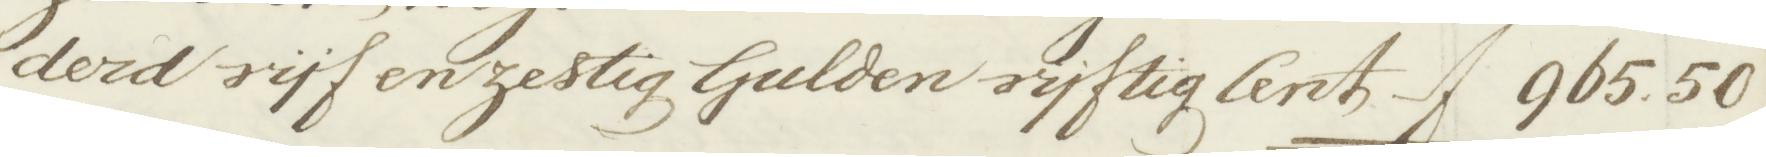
derd vijf en zestig Gulden vijftig Cent ƒ 965.50
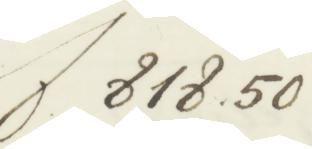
ƒ. 818.50
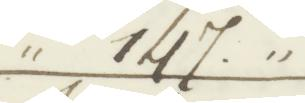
„ 147. „
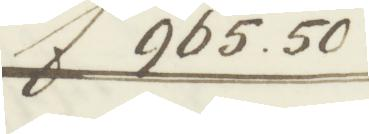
ƒ 965.50
